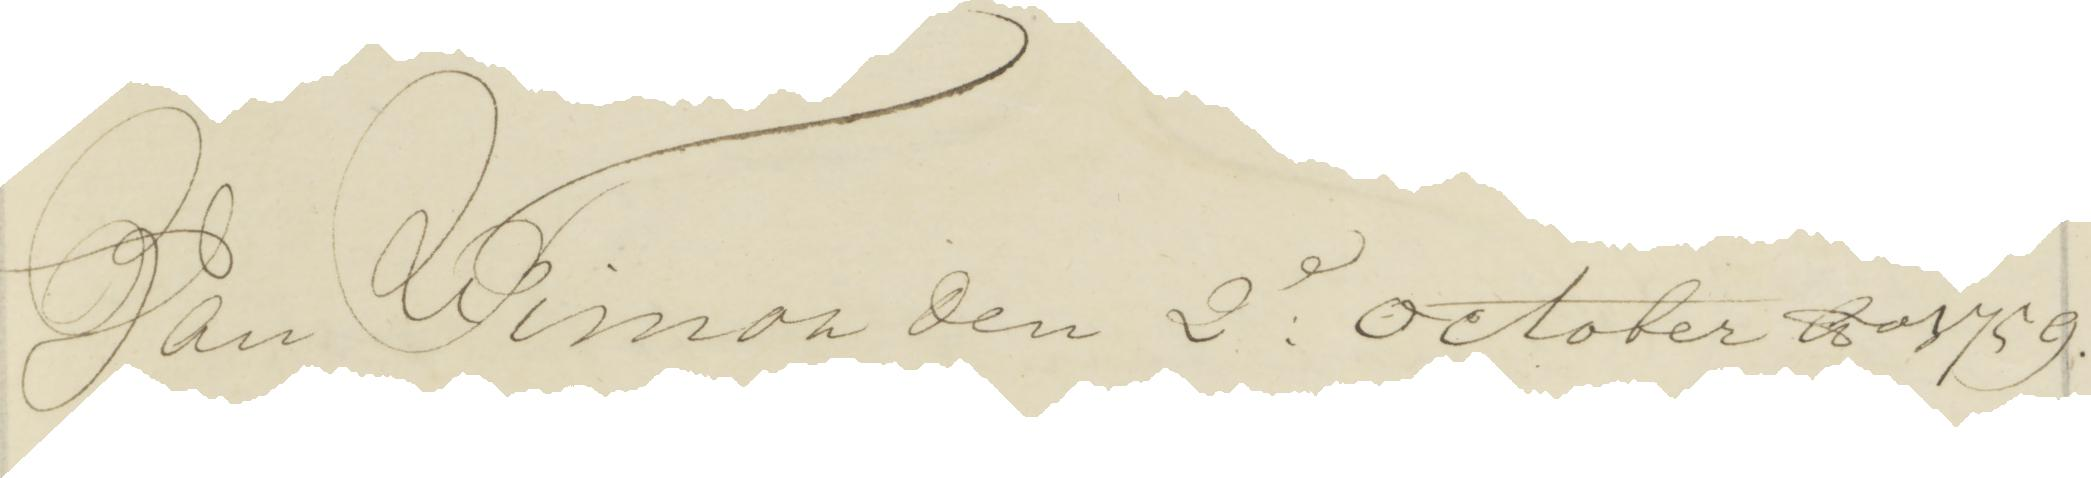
Van Timor den 2:e october Ao1759.
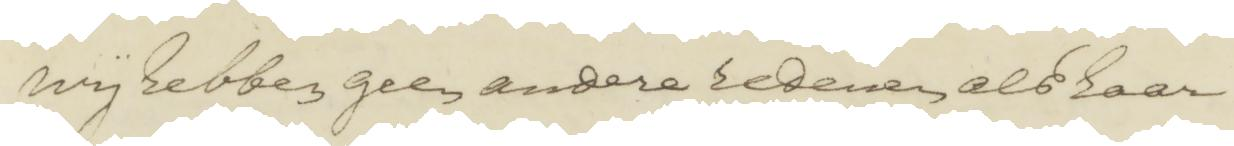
wij hebben geen andere redenen als haar
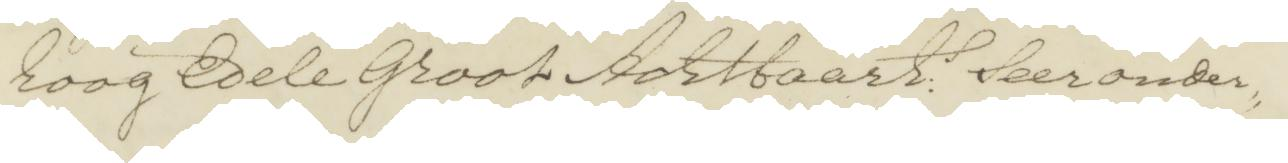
hoog Edele Groot Achtbaarh:s seer onder„
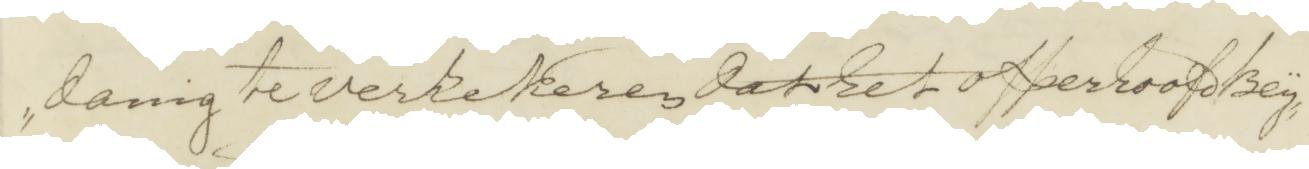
„danig te verzekeren dat het opperhoofd Beij„
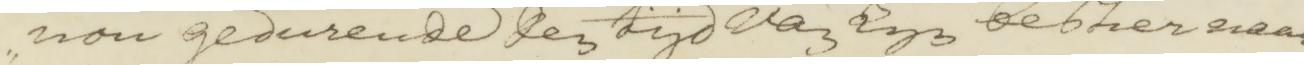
„non gedurende den tijd van zijn bestier naar
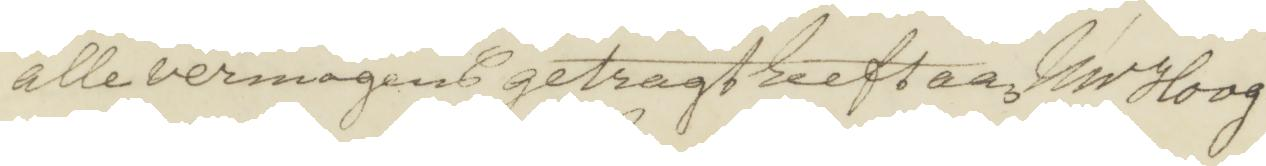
alle vermogens getragt heeft aan Uw Hoog
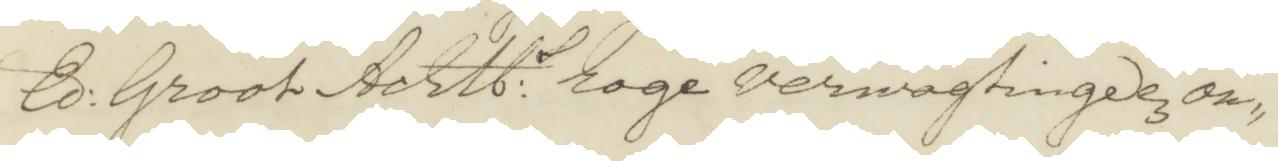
Ed: Groot Achtb:s hoge verwagtinge en or„
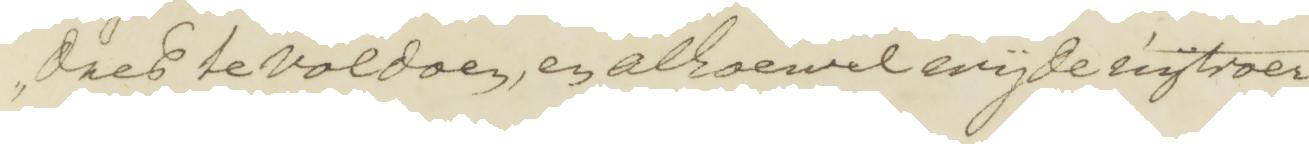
„dres te voldoen, en alhoewel wij de uijt voer
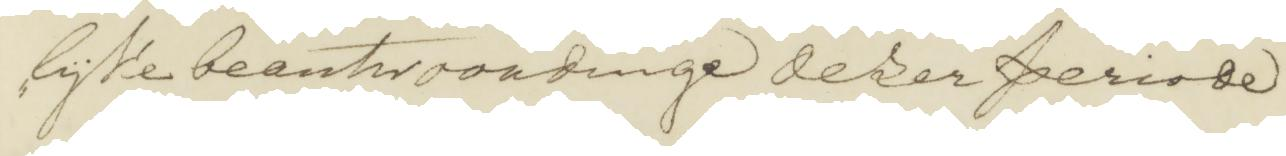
„lijke beantwoordinge dezer periode
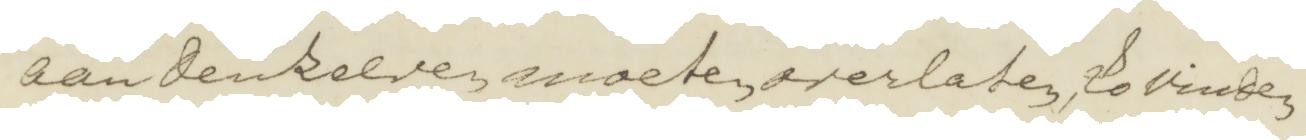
aan denzelven moeten overlaten, zo vinden
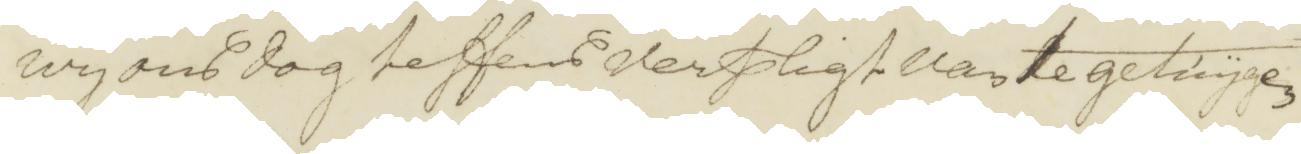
wij ons dog teffens verpligt van te getuijgen
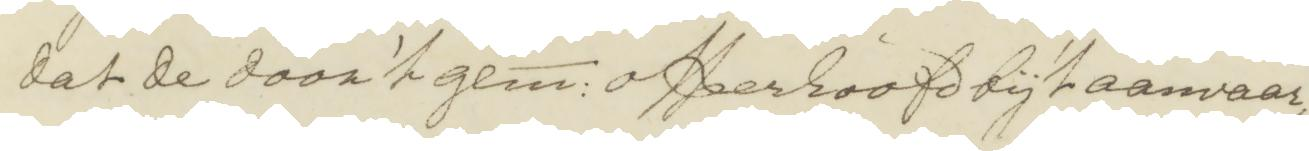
dat de door ’t gem: opperhoofd bij ’t aanvaar„
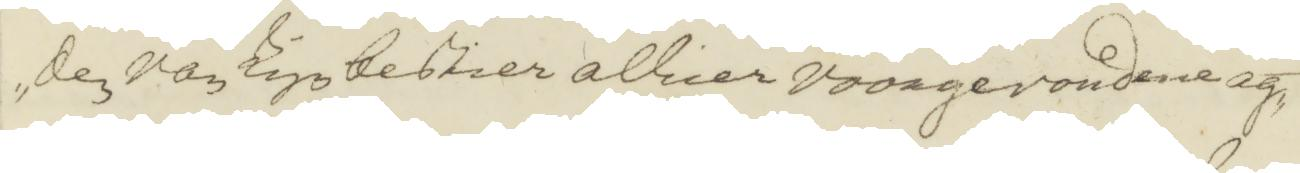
„den van zijn bestier alhier voor gevondene ag„
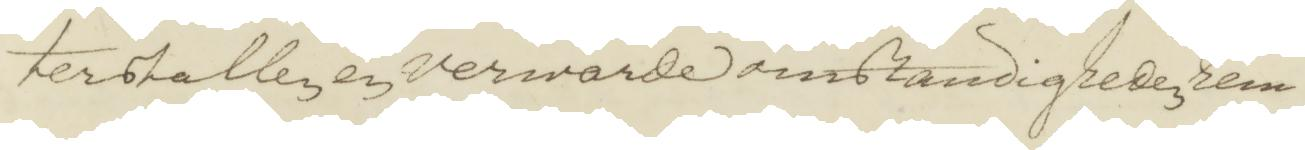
terstallen en verwarde omstandigheden hem
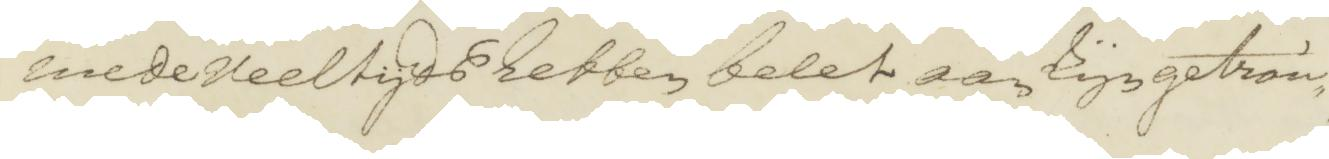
mede veeltijds hebben belet aan zijn getrou„
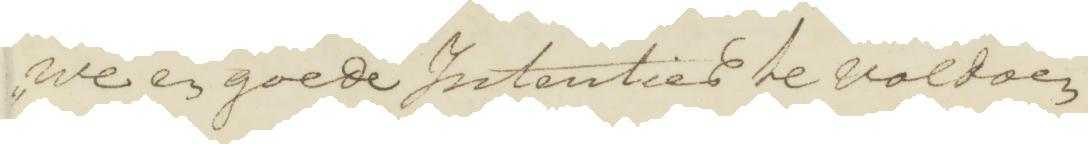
„we en goede Jntenties te voldoen
